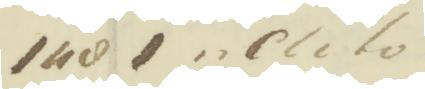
148 1 „ dito
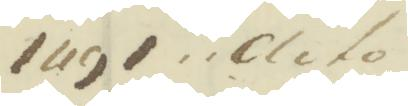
149 1 „ dito
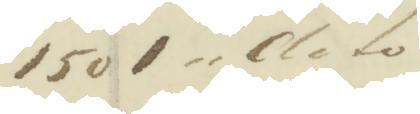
150 1 „ dito
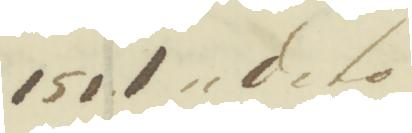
151. 1 „ dito
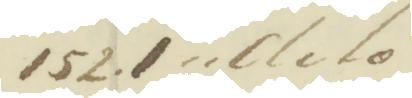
152. 1 „ dito
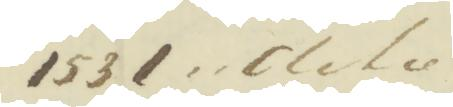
153 1 „ dito
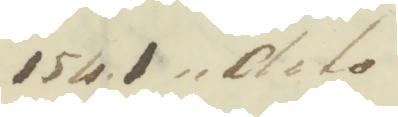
154.1 „ dito
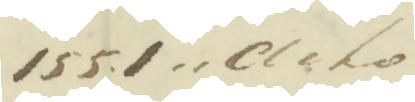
155. 1 „ dito
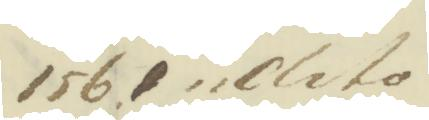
156. 1 „ dito
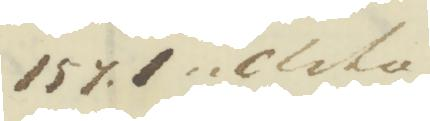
157. 1 „ dito
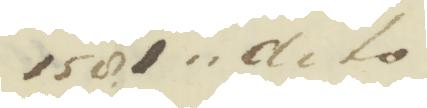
158. 1 „ dito
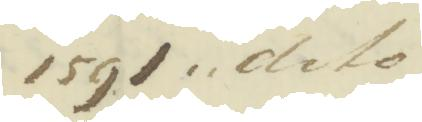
159. 1 „ dito
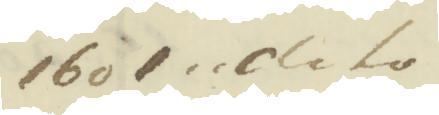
160 1 „ dito
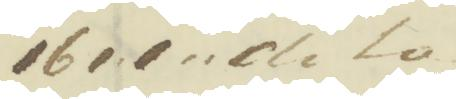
161. 1 „ dito
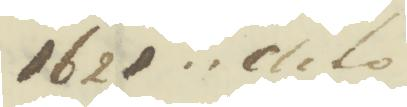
162 1 „ dito
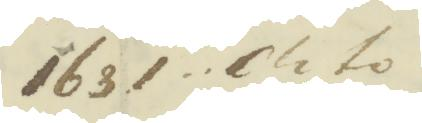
163. 1 „ dito
